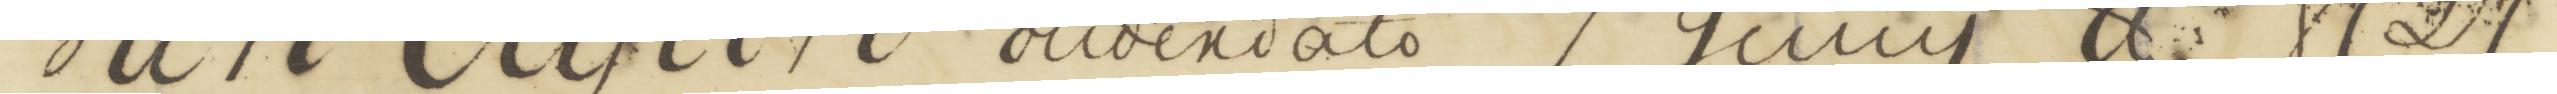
Van Ceylon onderdato 7 Junij A:o 1727
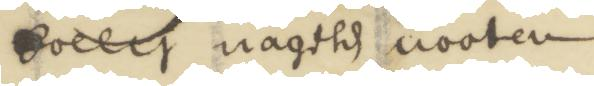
foely nagelen nooten
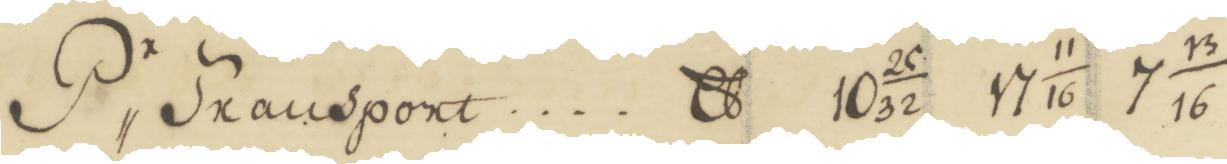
P„r Transport .... lb 10 25/32 17 11/16 7 13/16
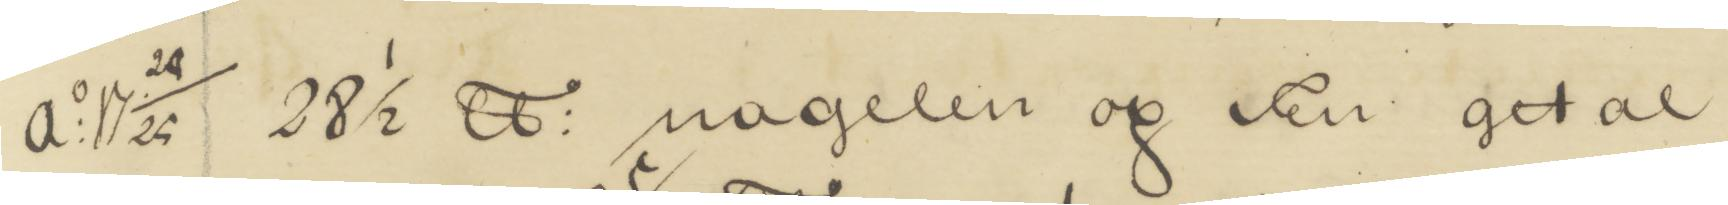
A:o 17 24/25 28½ lb: nagelen op Een getal
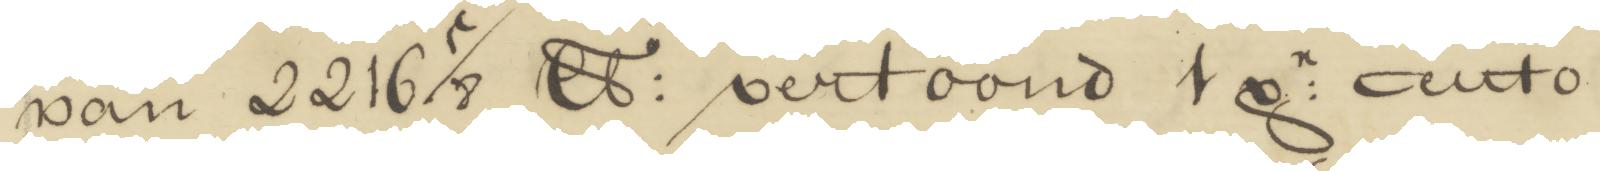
van 2216 5/8 lb: vertoond 1 p:r cento
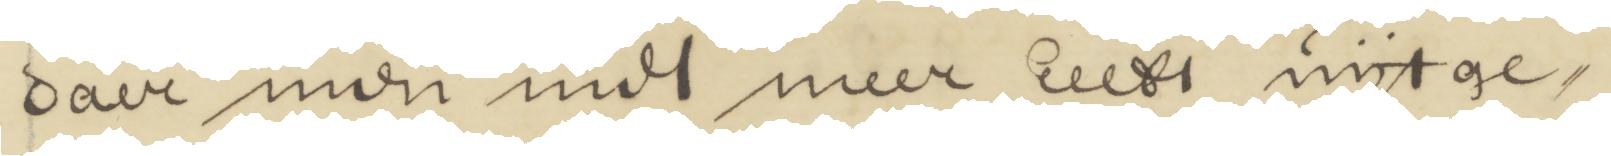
daer men niet meer heeft uijtge„
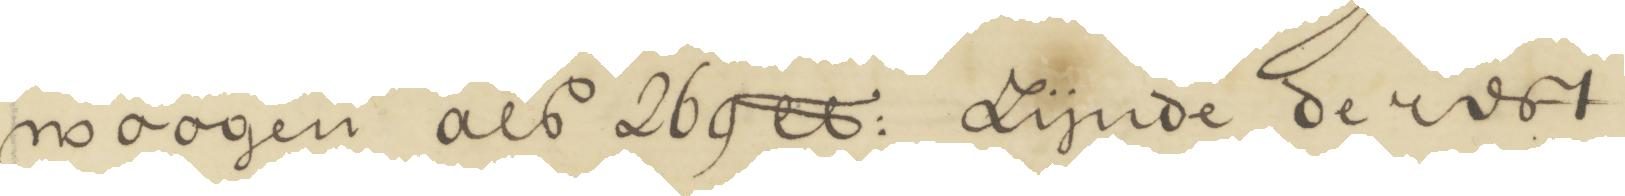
woogen als 269 lb: zijnde de rest
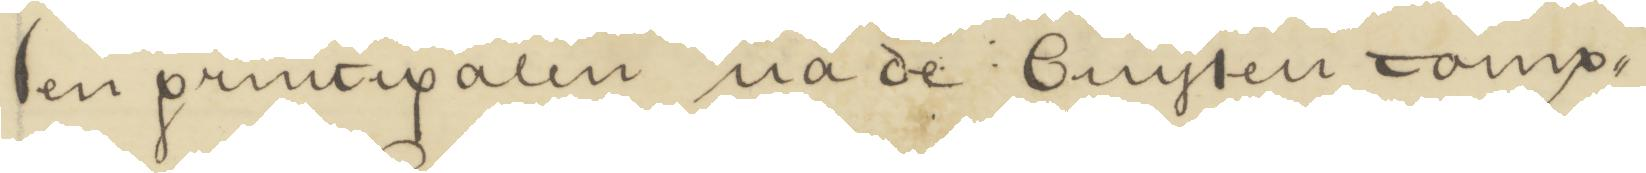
ten principalen na de buijten comp„
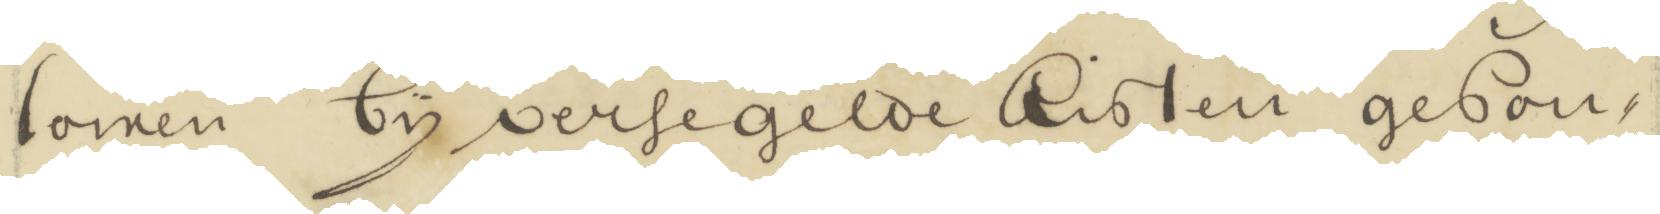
toiren bij versegelde kisten geson„
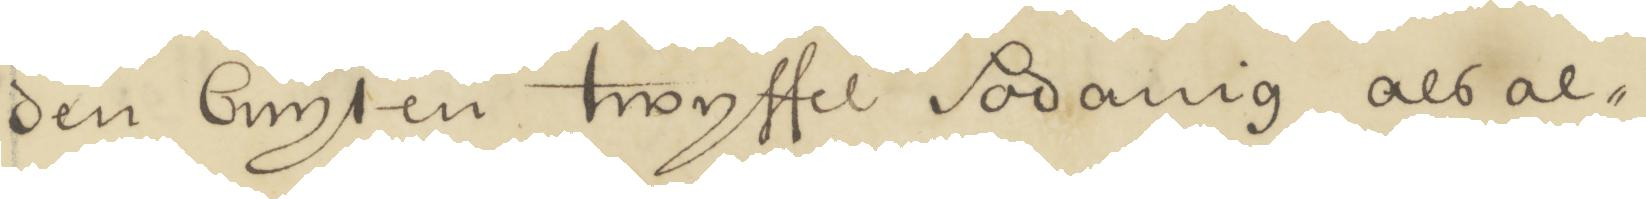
den buyten twyffel sodanig als al„
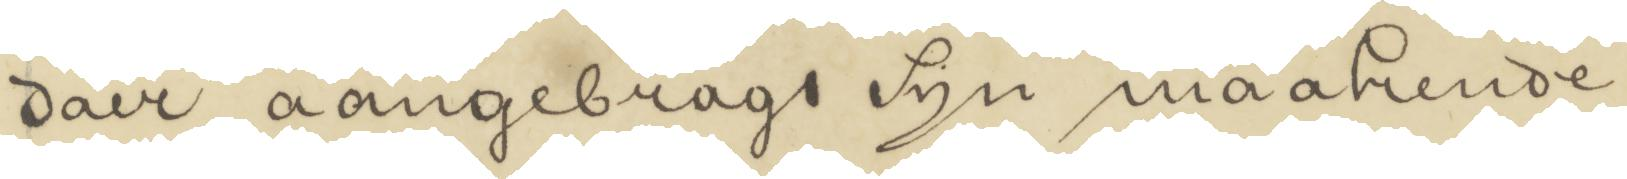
daer aangebragt sijn maakende
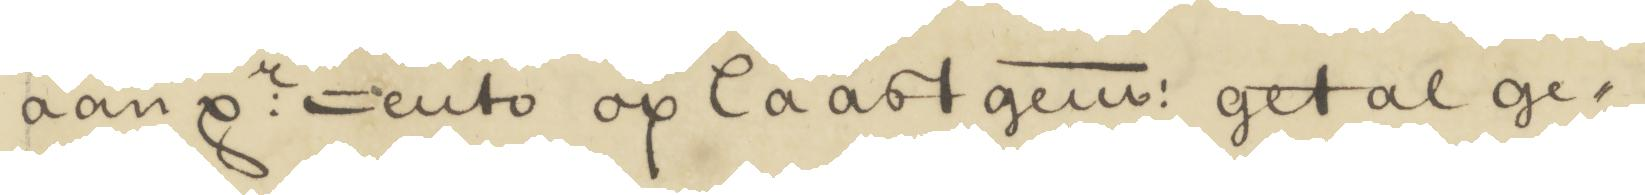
aan p:r cento op laast gem: getal ge„
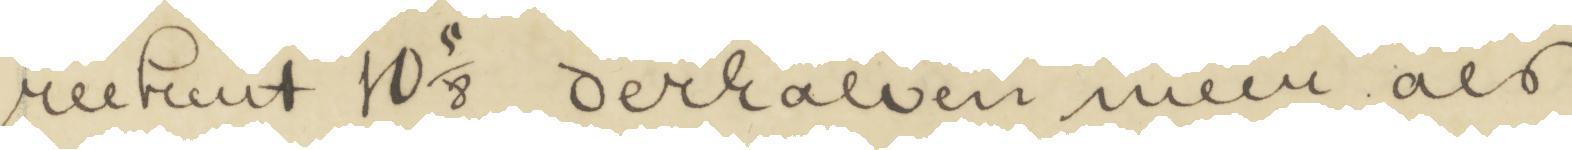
reekent 10 5/8 derhalven meer als
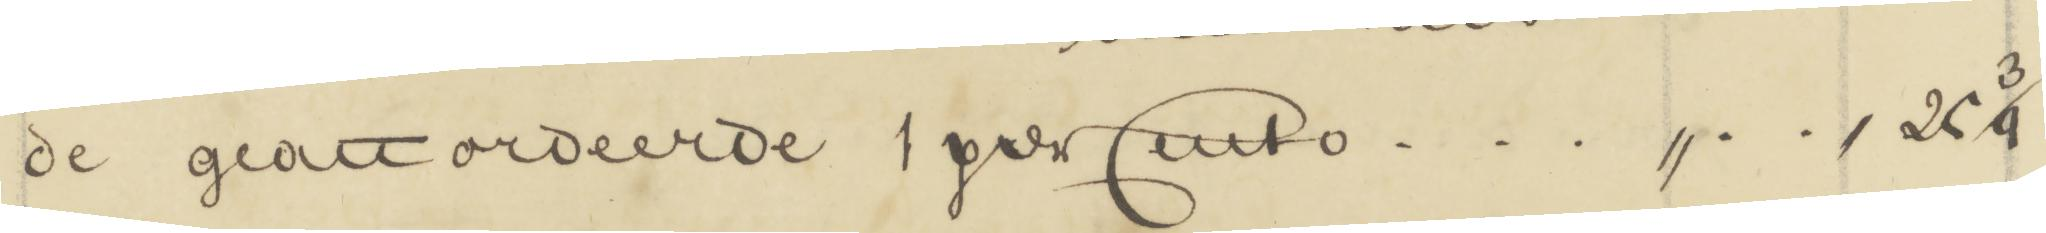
de geaccordeerde 1 percento . . . „ . . „25 3/4
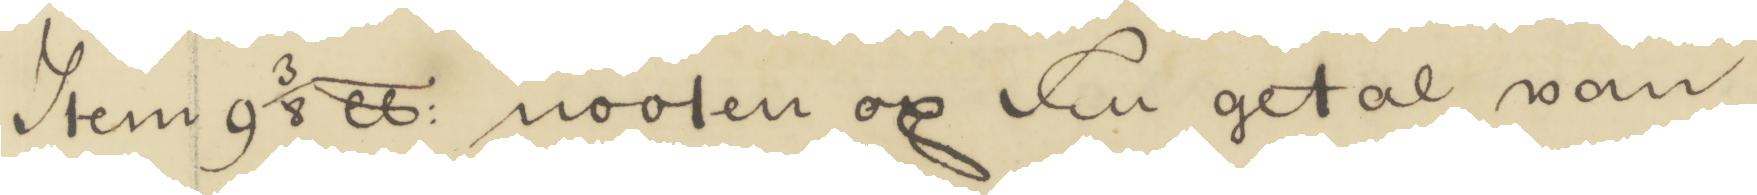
Item 9 3/8 lb: nooten op Een getal van
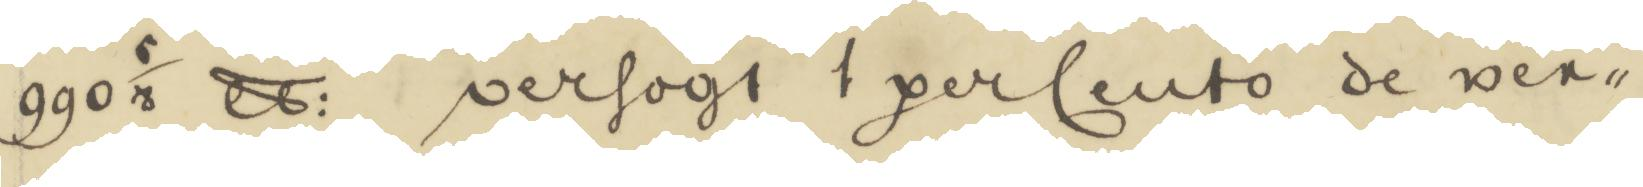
990 5/8 lb: versogt 1 percento de ver„
